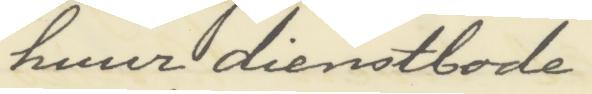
huur dienstbode
